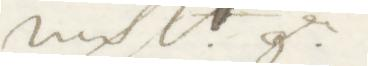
inver l.t g.r
